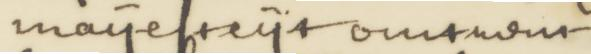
maijesteijt omtrent
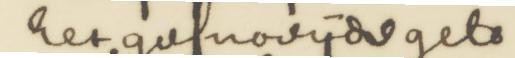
het gesnoeijde geld
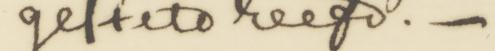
gesteld heefd. —
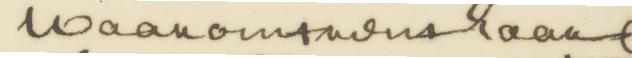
waaromtrent haar
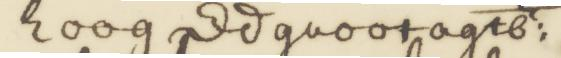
hoog Ed groot agtb:
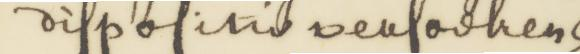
dispositie versoeken
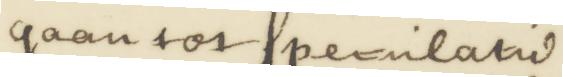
gaan tot speculatie
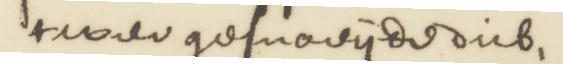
twee gesnoeijde dub,
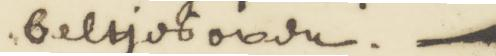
„beltjes over. —
